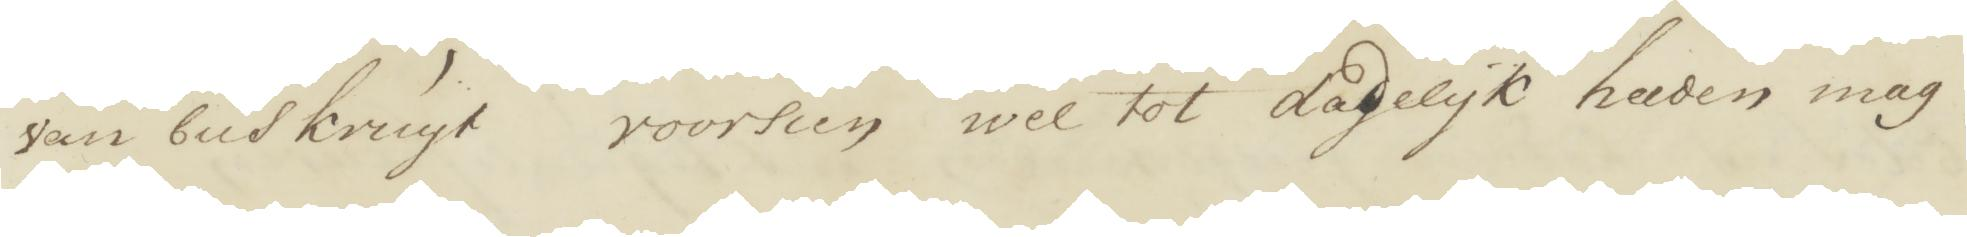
van buskruijt voorsien wel tot dadelijk heeden mag
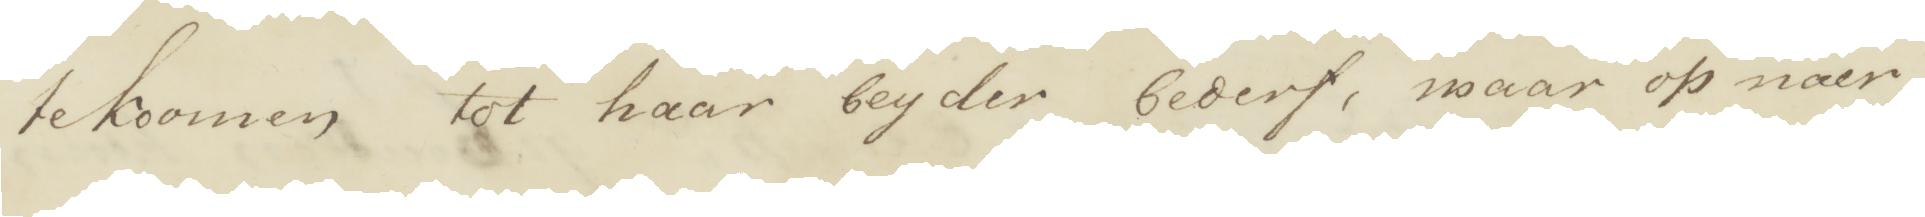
tekoomen tot haar beyder bederf, waar op naer
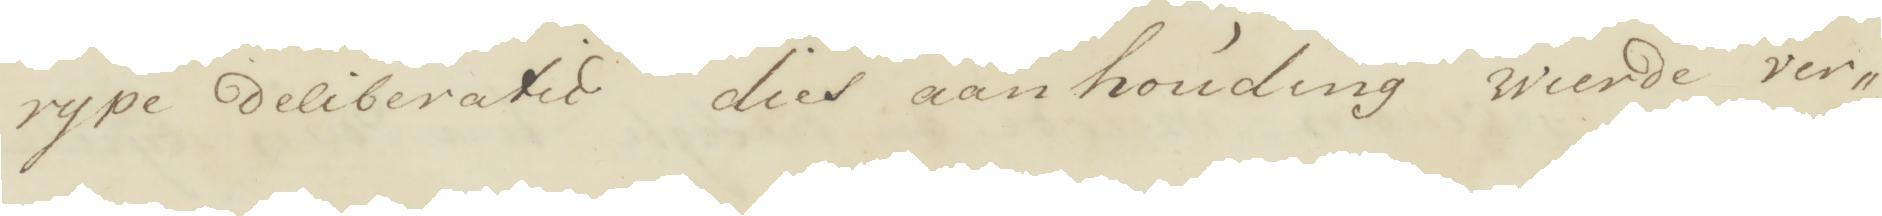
rype deliberatie dies aanhouding wierde ver„
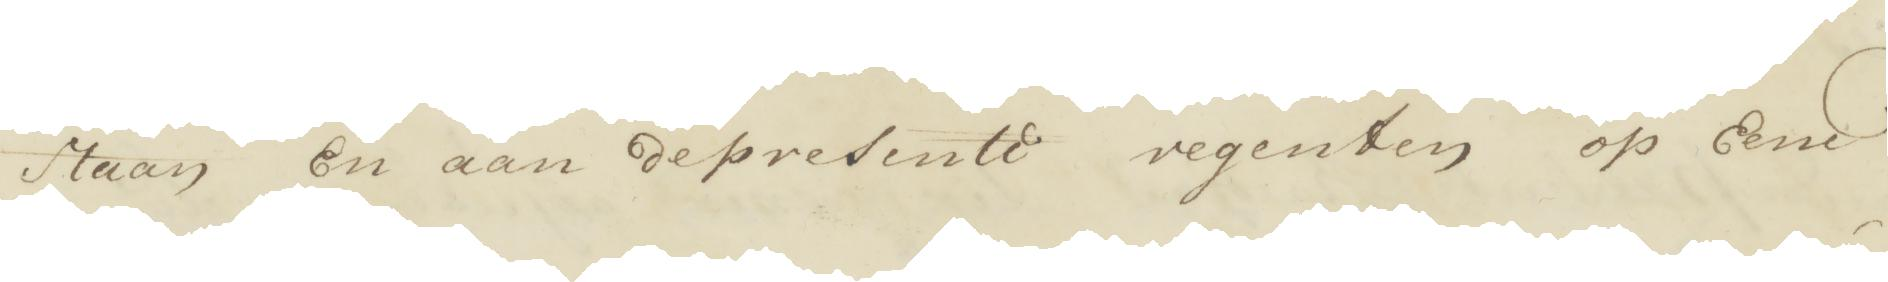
staan En aan depresente regenten op Eene
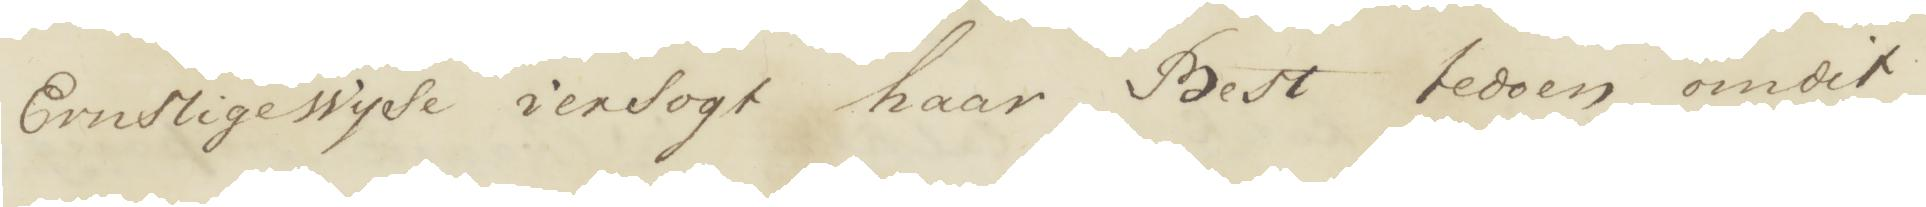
Ernstigewijse versogt haar Best tedoen om dit
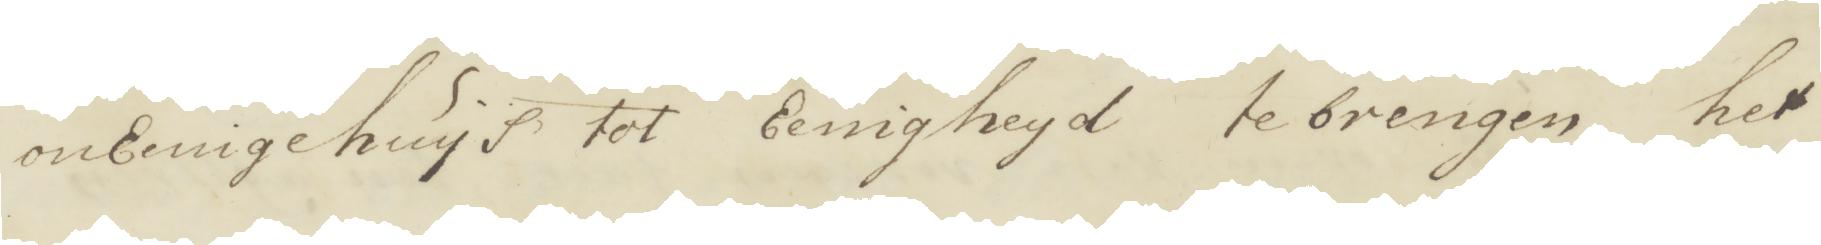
onEenigehuijs tot Eenigheyd te brengen het
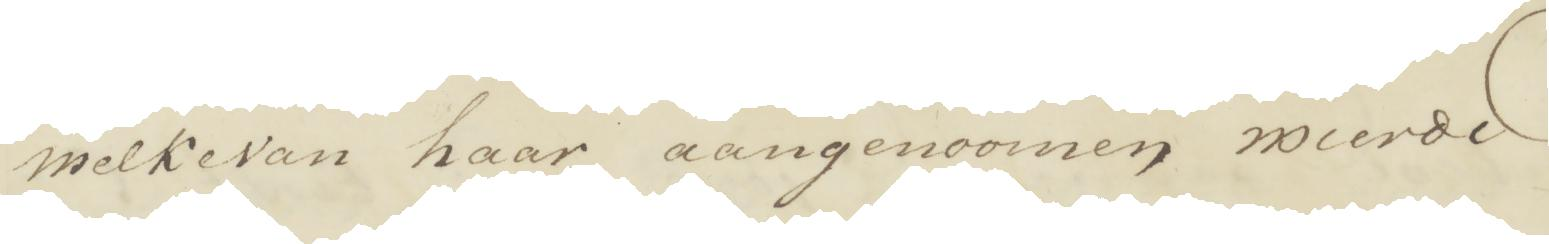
welke van haar aangenoomen wierde
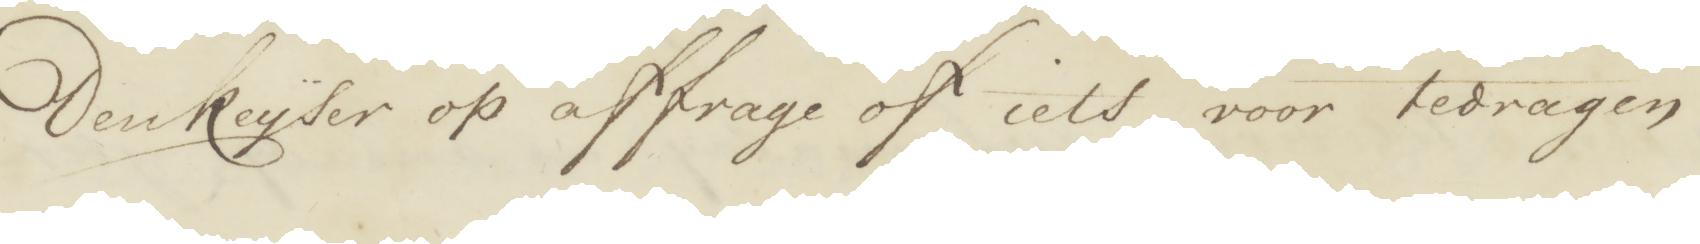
Den keijser op affrage of iets voor tedragen
